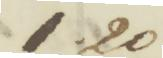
1.20
